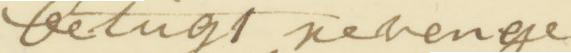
betugt revenge
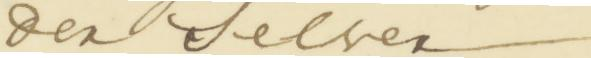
der selver
